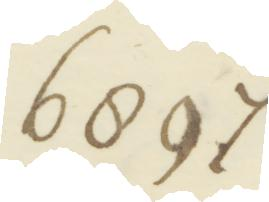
6897
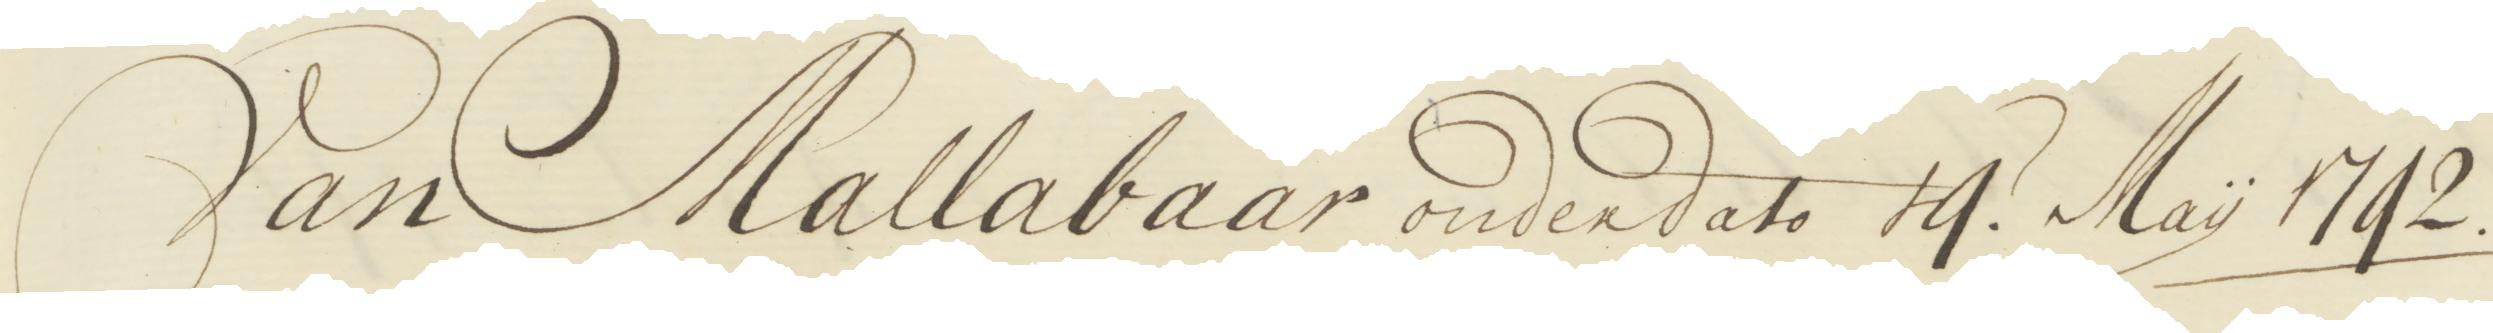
Van Mallabaar onder dato 14:' Maij 1742.
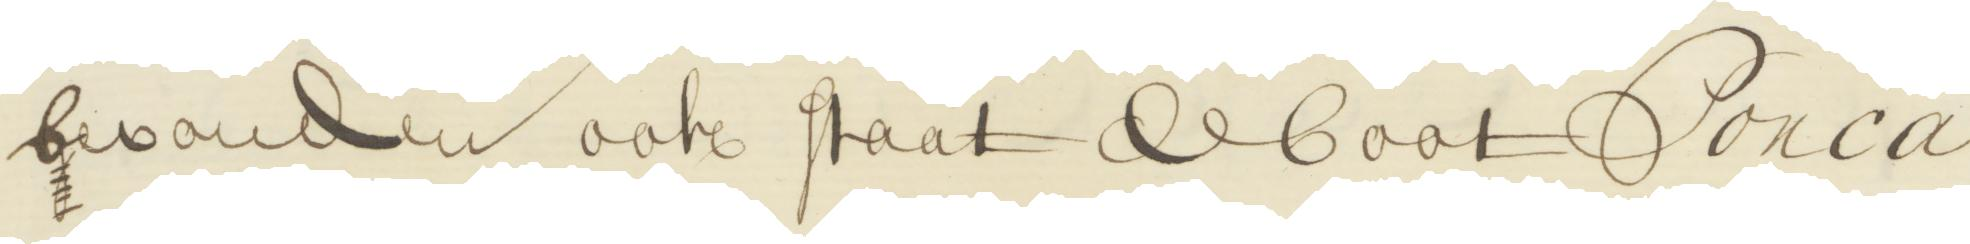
bevonden ook staat deboot Porca
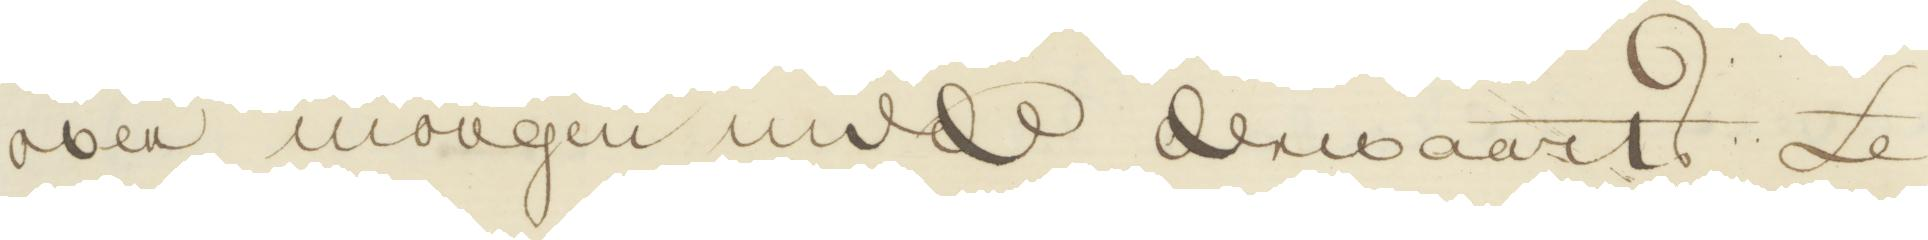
over morgen mede derwaarts te
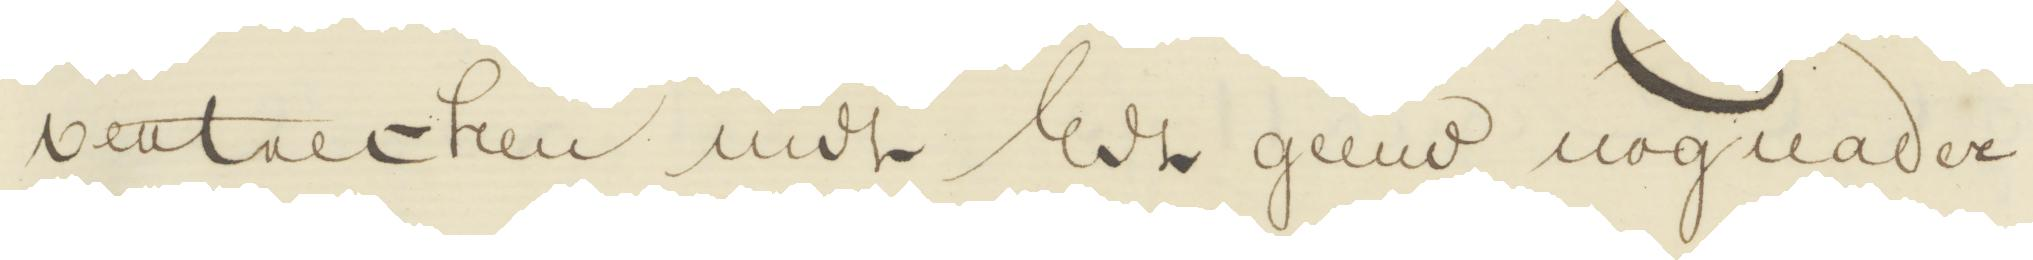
vertrecken met het geene nog nader
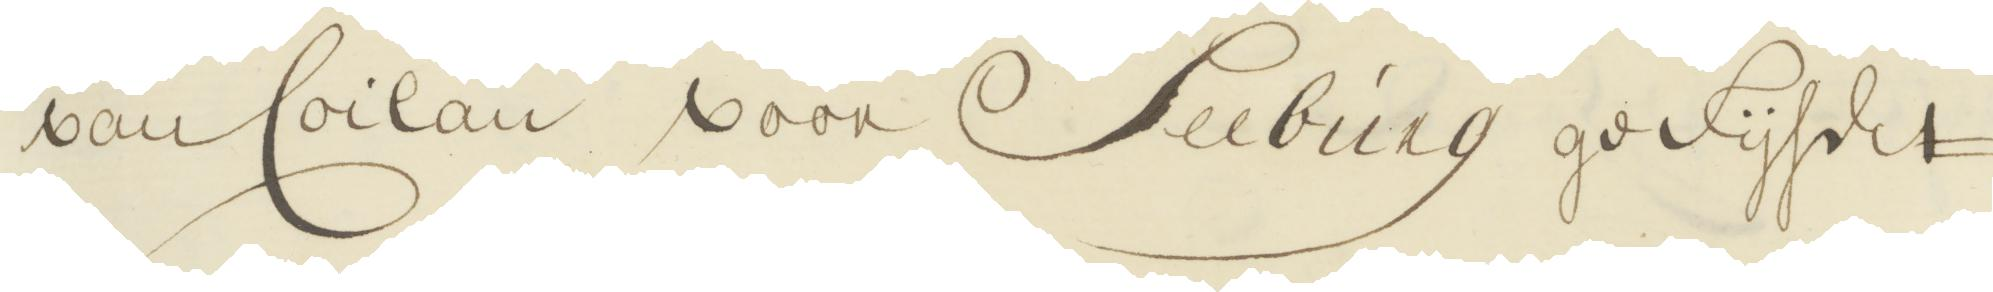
van Coilan voor Seeburg geEijscht
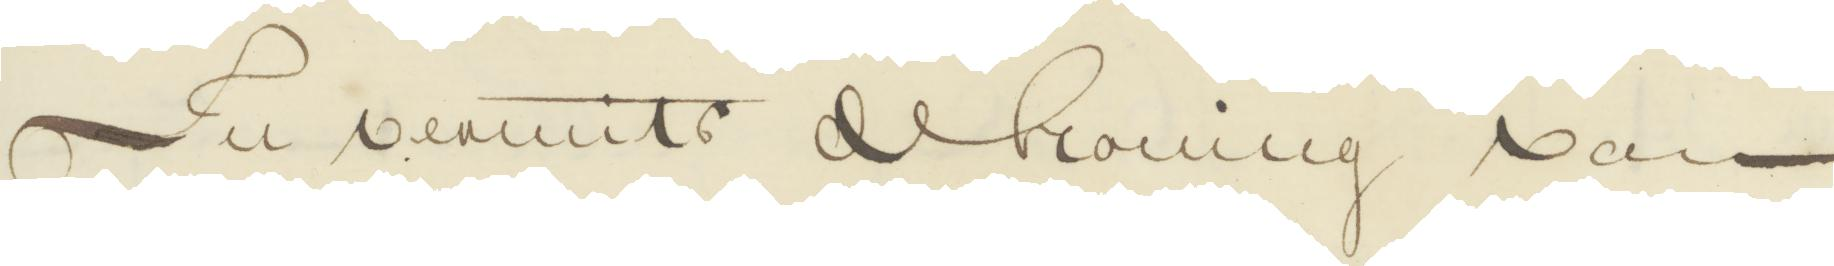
En vermits de koning van
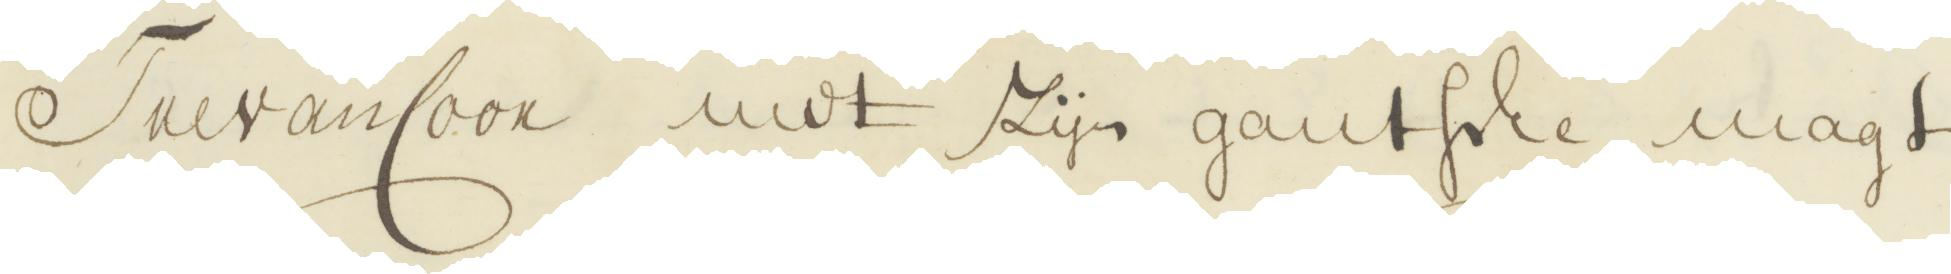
Trevancoor met zijn gantsche magt
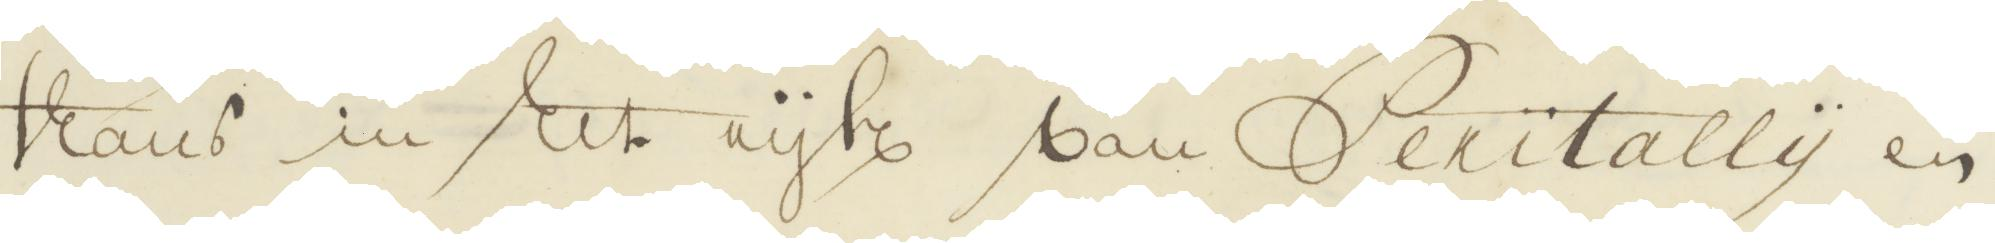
thans in het rijk van Peritallij en
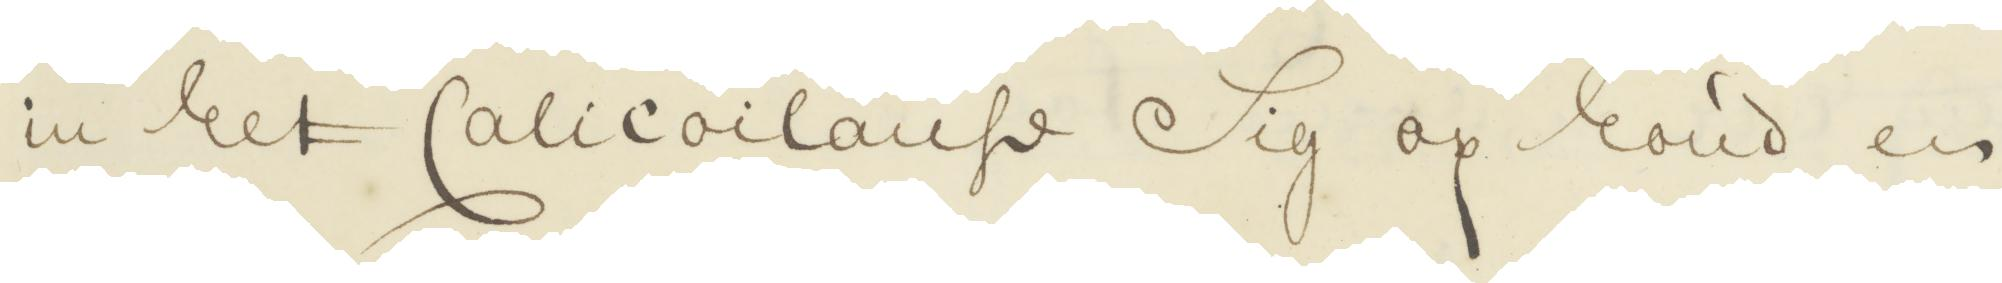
in het Calicoilanse sig op houd en
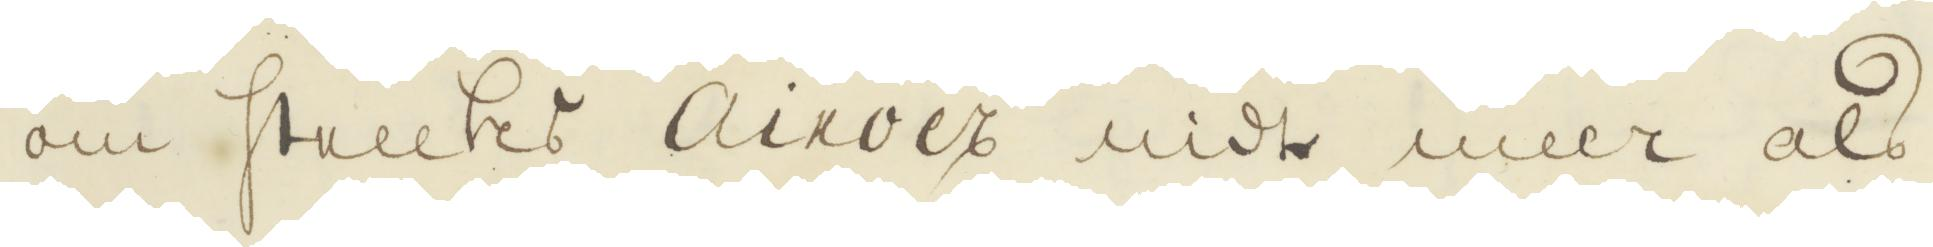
om streeks Airoer niet meer als
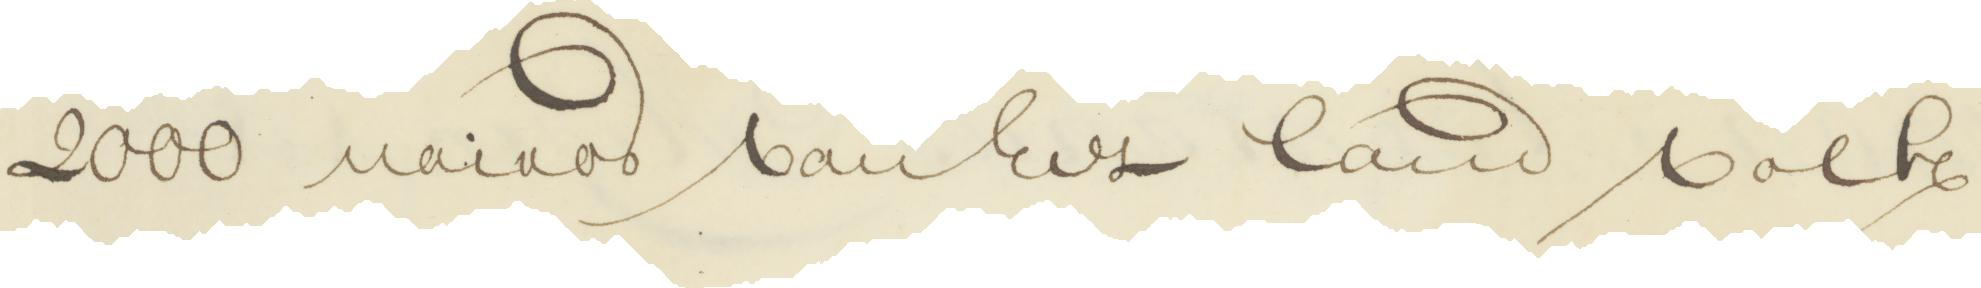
2000 nairod van het land volk
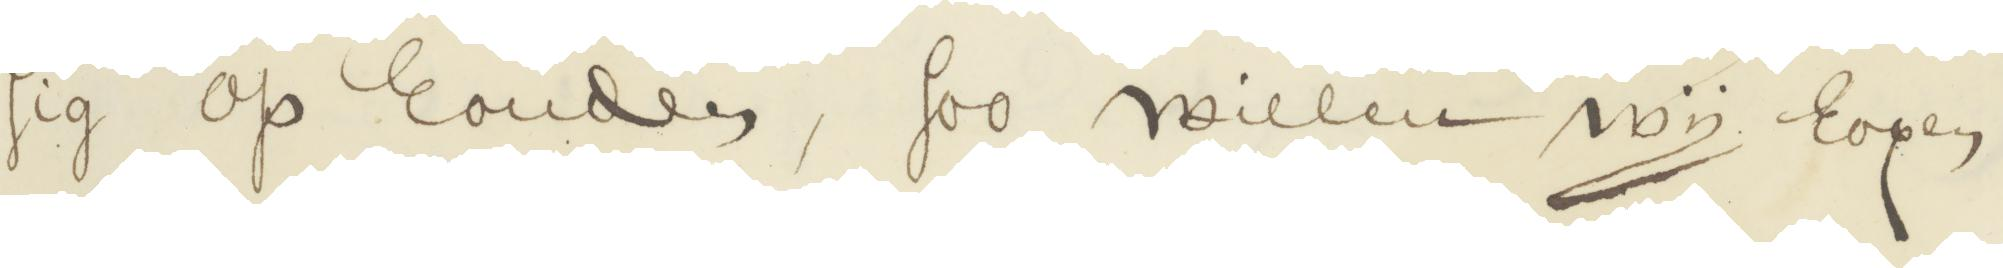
sig op houden, soo willen wij hopen
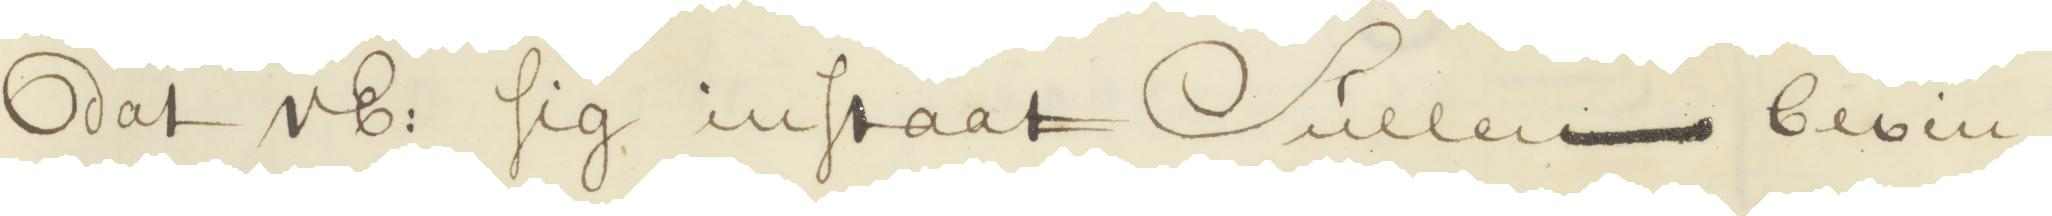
dat VE: sig instaat sullen bevin
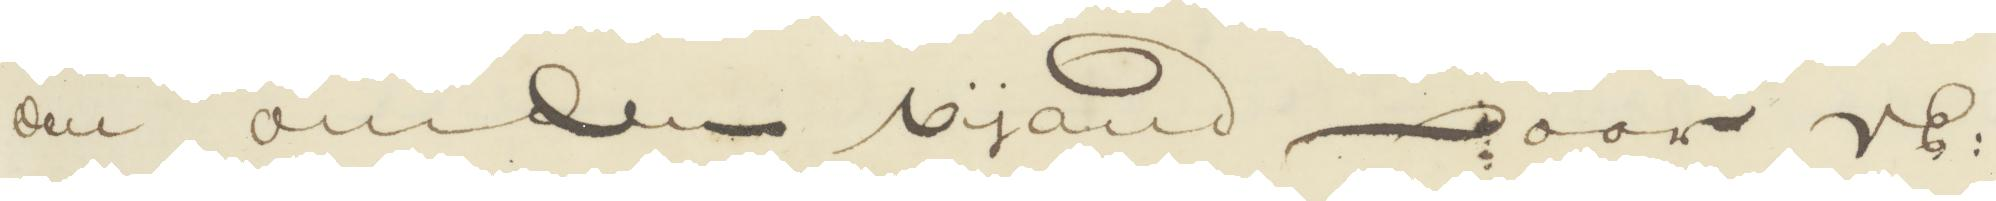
den om den vijand voor VE:
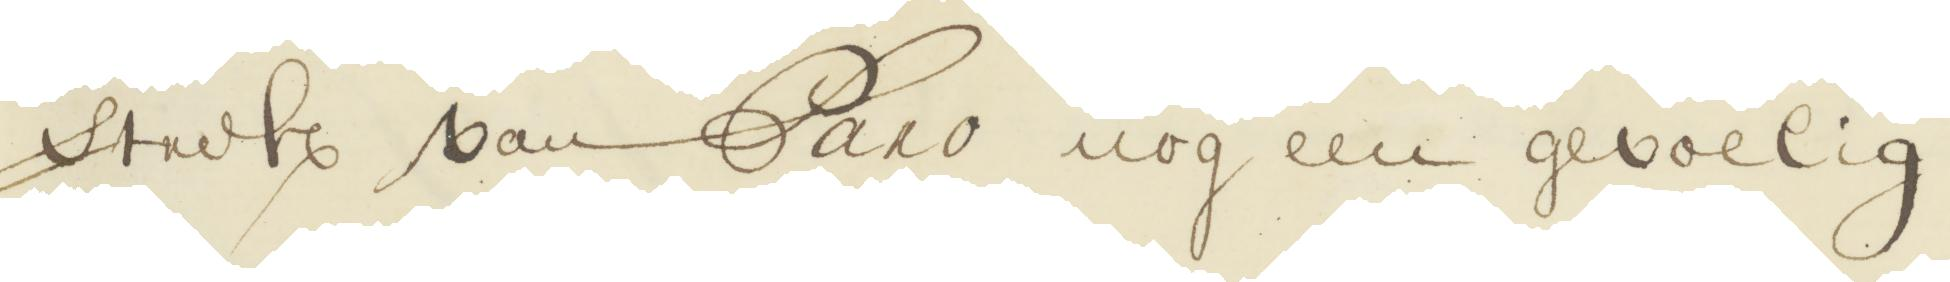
vertrek van Paro nog een gevoelig
